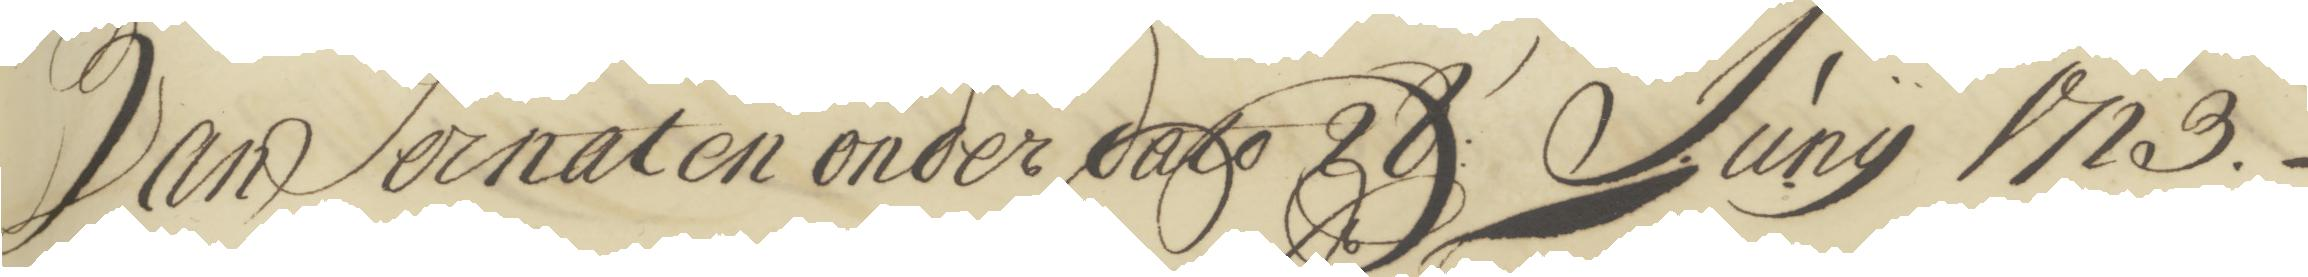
Van Ternaten onder dato 28:' Iunij 1723.
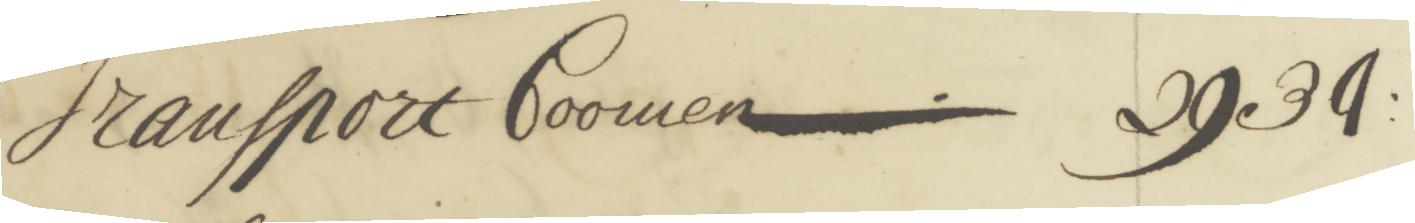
Transport boomen - 2934:
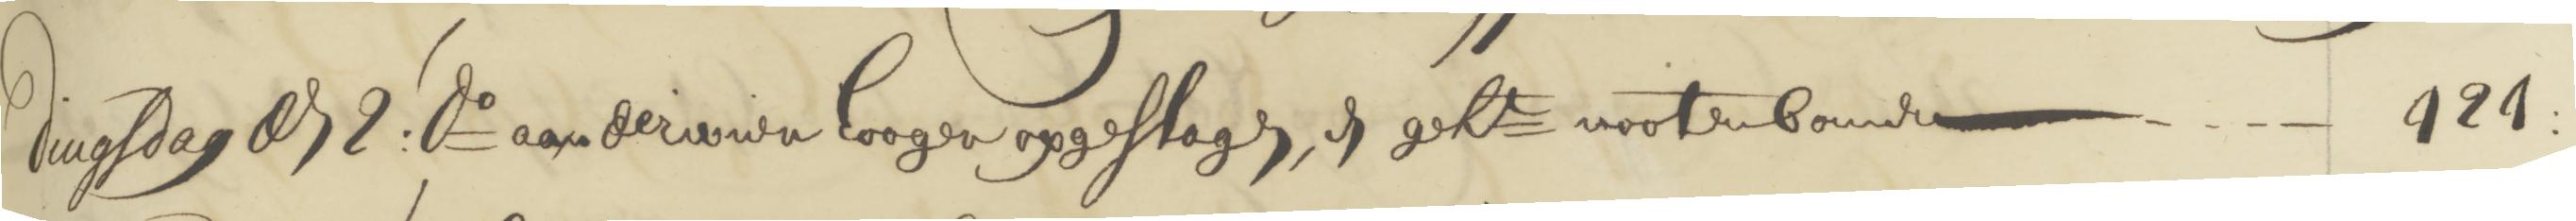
dingsdag den 2:' d=o aan derwien hooger op geslagen, en gek=t nooten bomen - - - - 424:
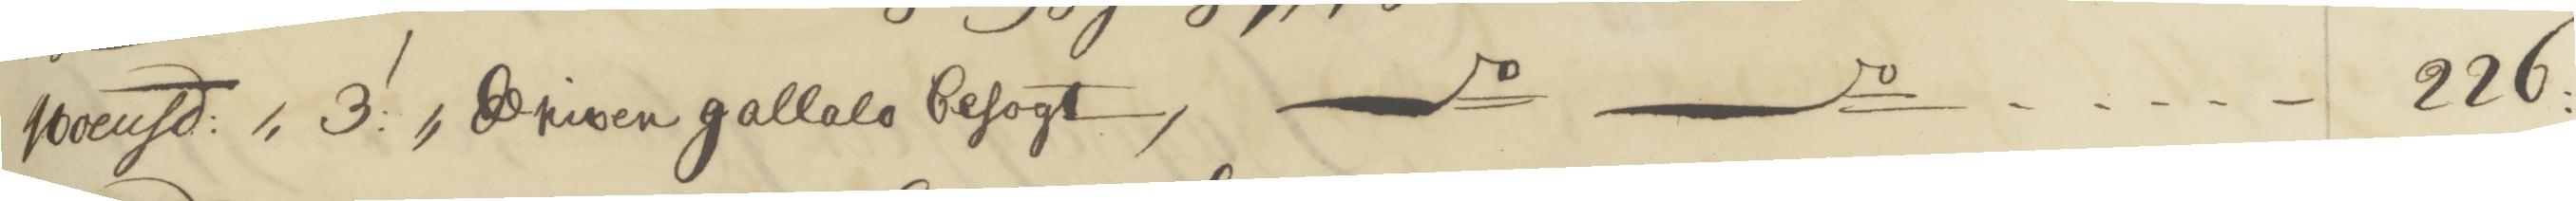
woensd: , 3:' „ de river gallalo besogt, —:o —:o - - - - - 226:
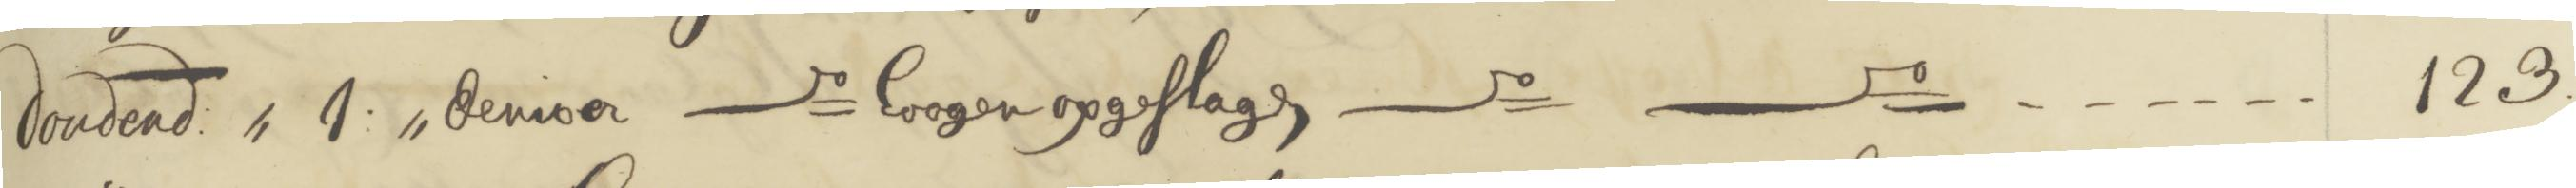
donderd: „ 4: „ de river D=o hooger op geslagen —:o —:o - - - - - - 123:
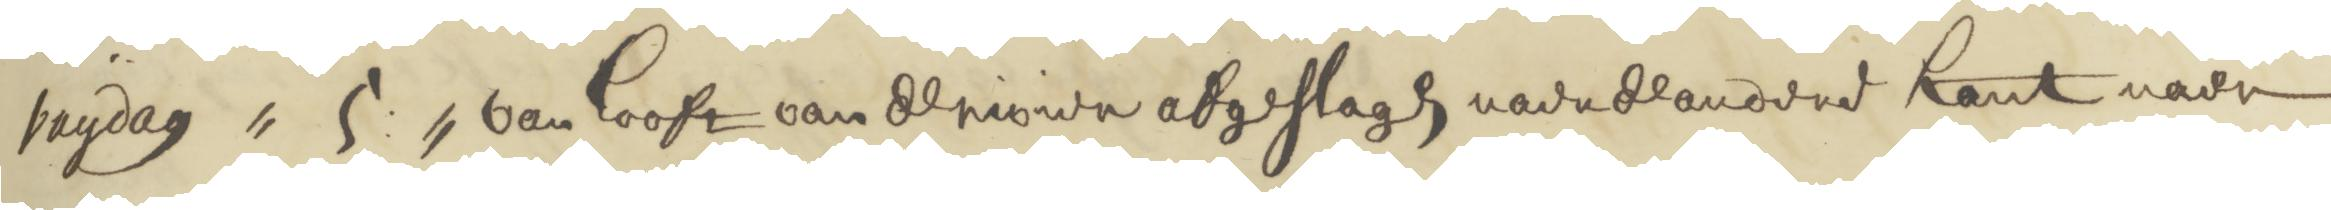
vrijdag „ 5: „ van hooft van de rivier afgeslagen naer de andere kant naer
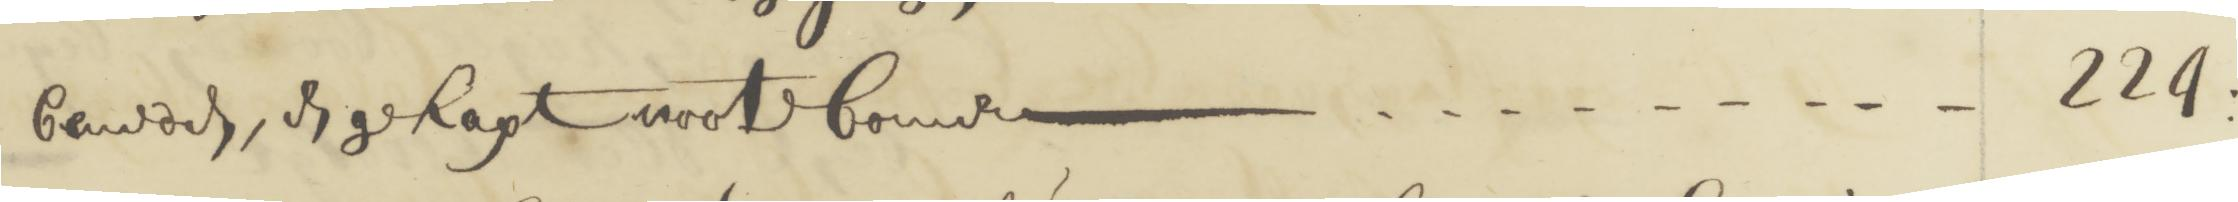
beneden, en gekapt nootebomen - - - - - - - - - - 224:
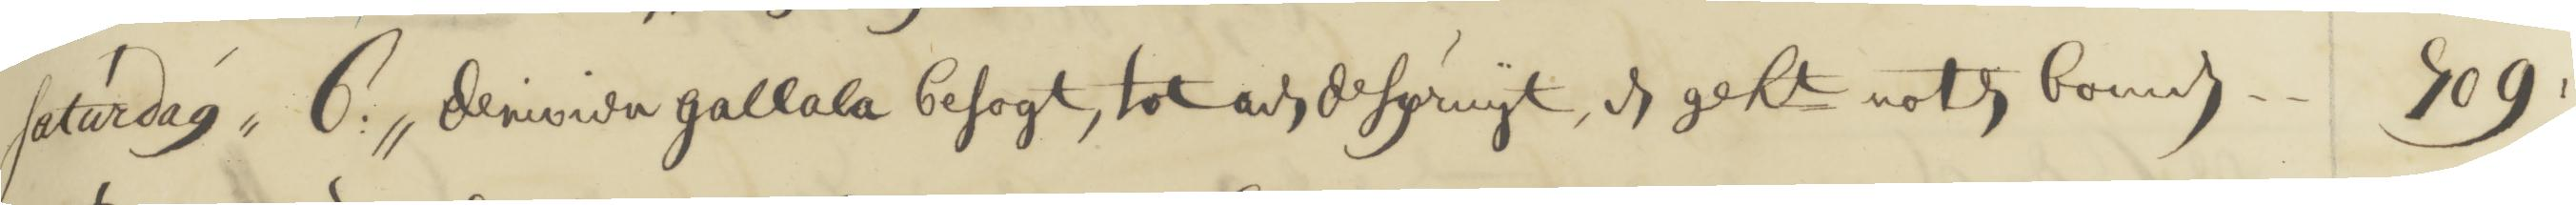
saturdag „ 6: „ de rivier gallala besogt, tot aen de spruijt, en gek=t noten bomen - - 709:
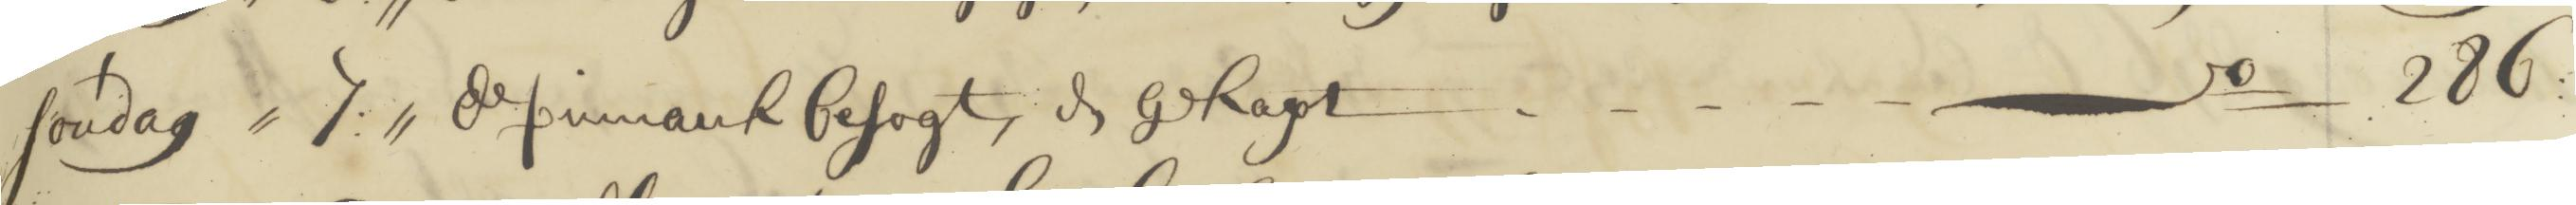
sondag „ 7: „ de pinnank besogt, en gekapt - - - - - —:o 286:
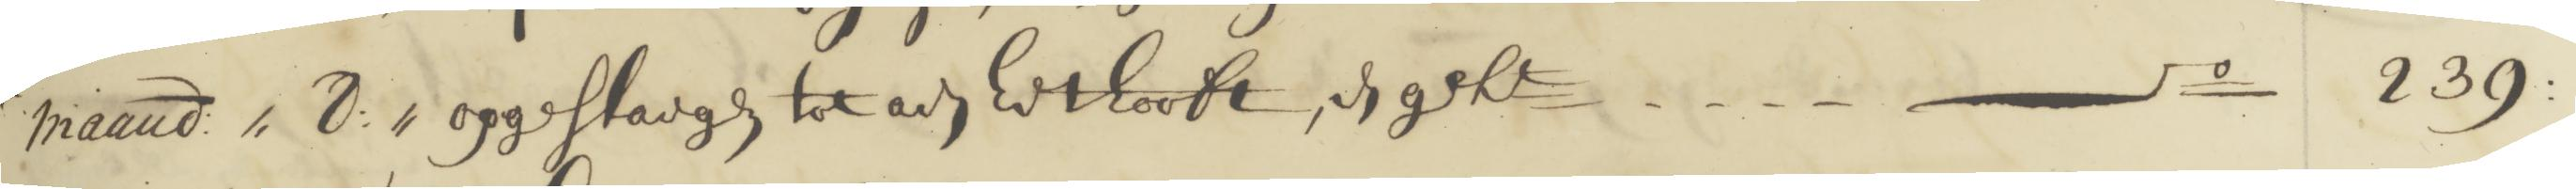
maand: „ 8: „ opgeslaegen tot aen het hooft, en gek=t - - - - - —:o 239:
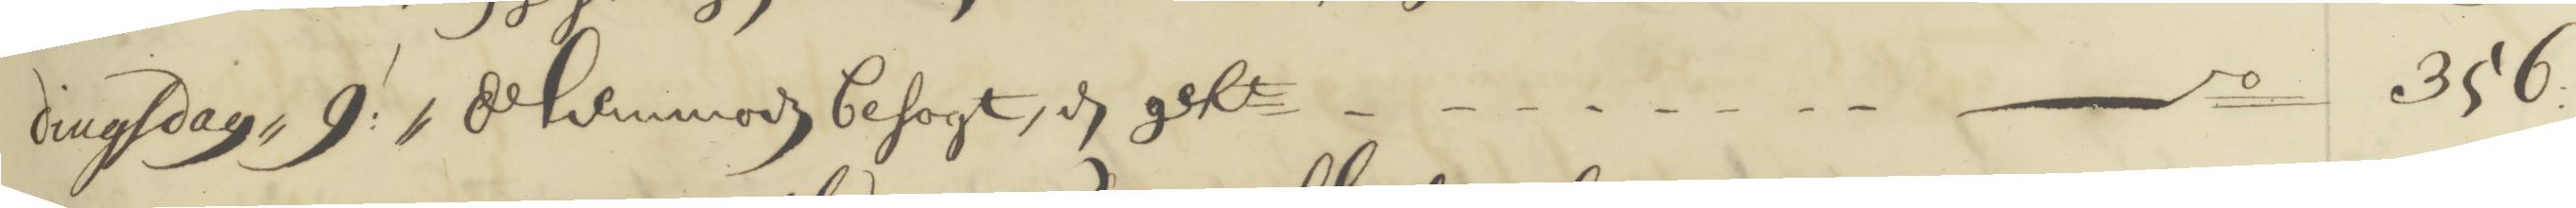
dingsdag „ 9:' „ de lemmoen besogt, en gek=t - - - - - - - —:o 356:
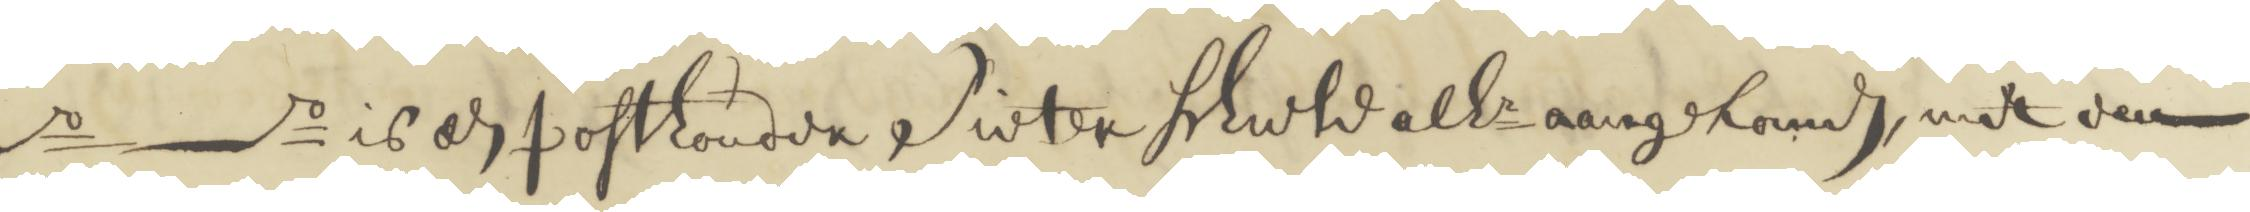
—:o —:o is den posthouder Pieter schiele alh=r aangekomen, met een
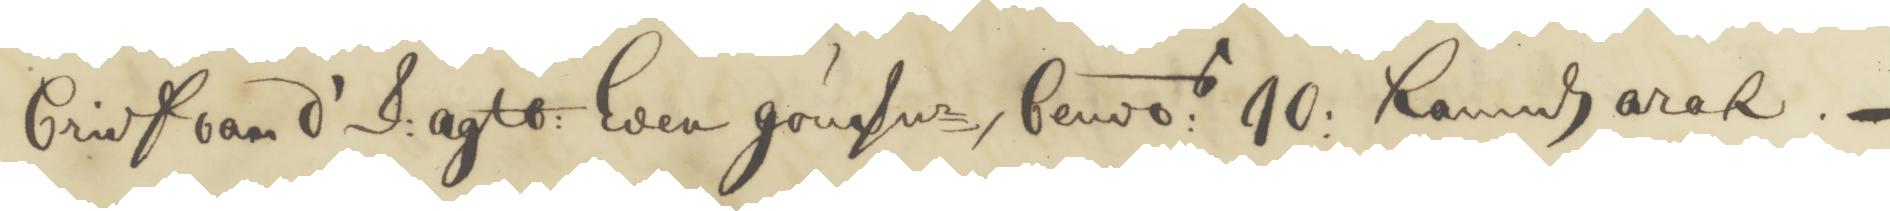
brief van d’ E: agtb: heer gouvern=r, benev:s 40: kannen arak. —
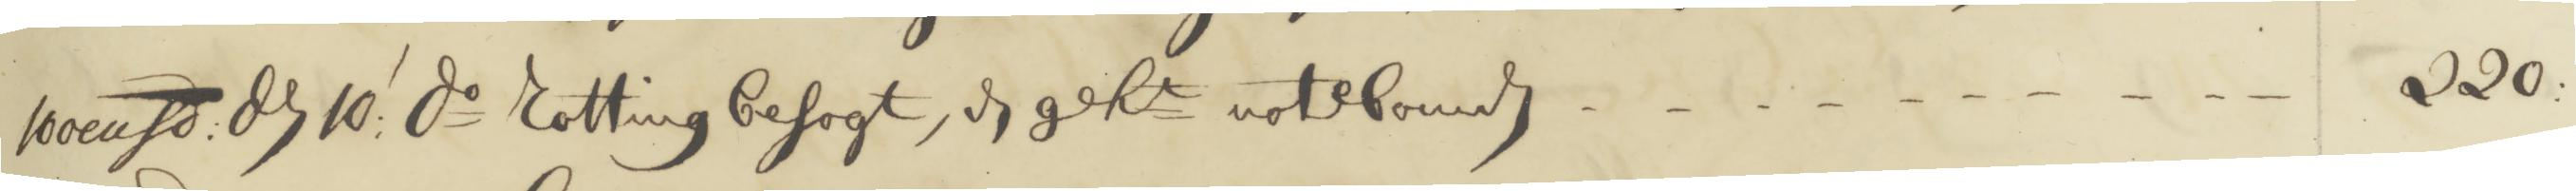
woensd: den 10:' d=o rotting besogt, en gek=t notebomen - - - - - - - - - - 220:
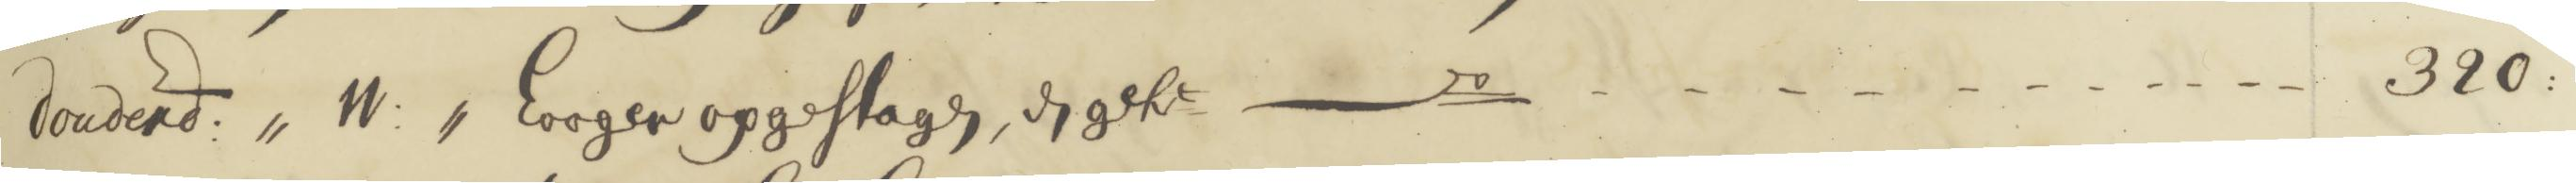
donderd: „ 11: „ hooger op geslagen, en gek=t —:o - - - - - - - - - - - 320:
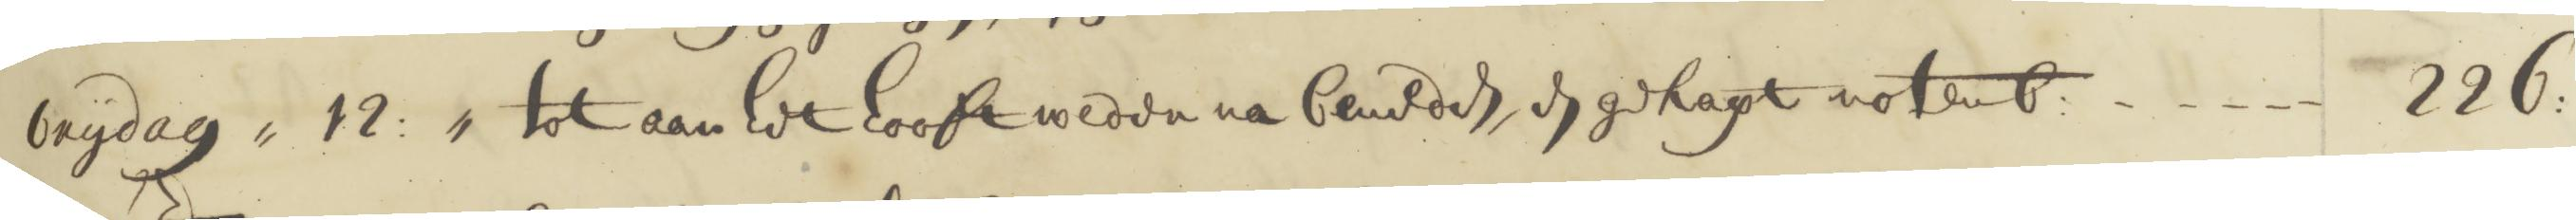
vrijdag „ 12: „ tot aan het hooft weder na beneden, en gekapt notenb: - - - - - 226:
